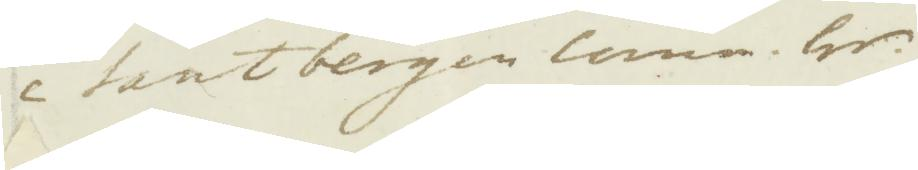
e tantbergen comm. Gr.
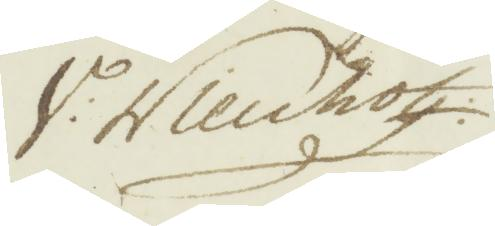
V: Wienhoff:
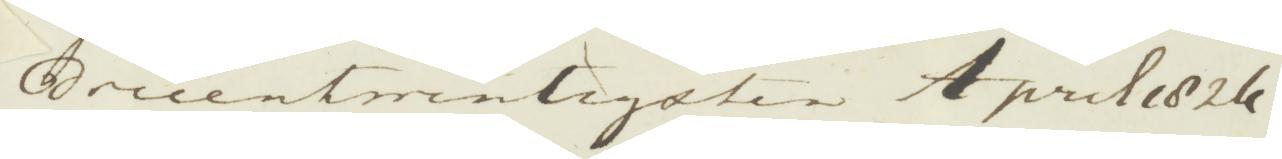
drieentwintigsten April 1824
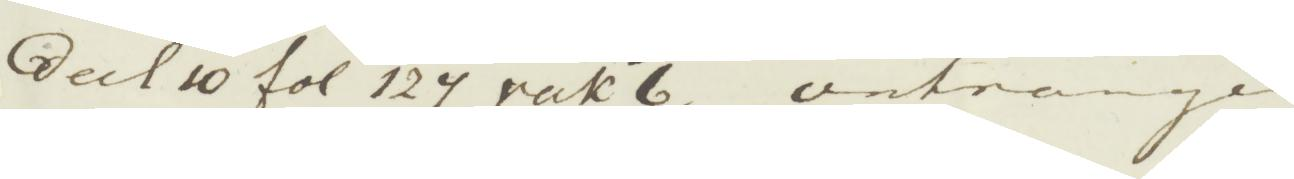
deel 10 fol 127 vak 6, ontvangen
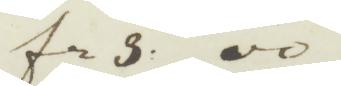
fr 3: 00
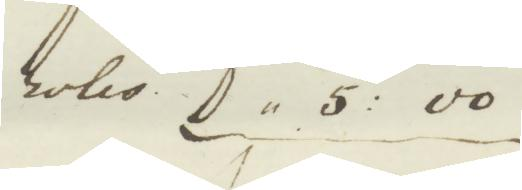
rolis „ 5: 00
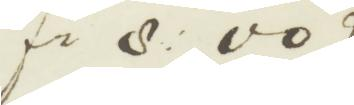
fr 8: 00
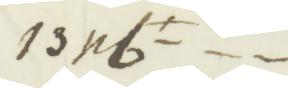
13 pC-t – –
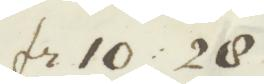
fr 10: 28
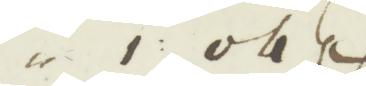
„ 1: 04
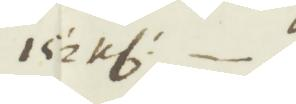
15½ pC-t – –
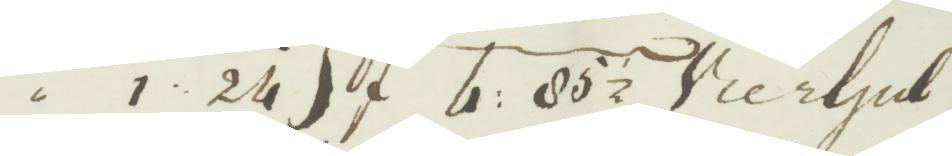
„ 1: 24 ƒ 4: 85½ Vier Gul
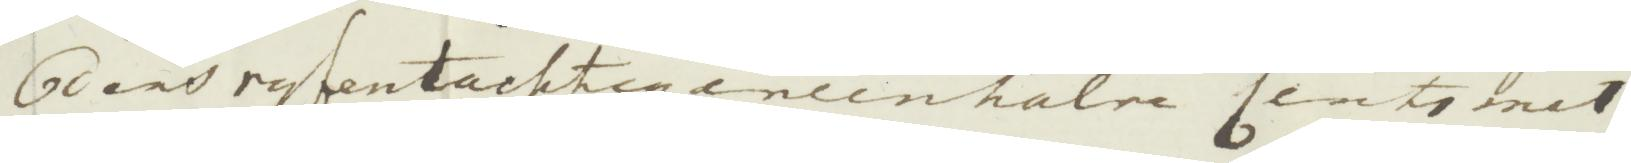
dens vyfentachtig en een halve Cents met
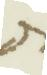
dn
